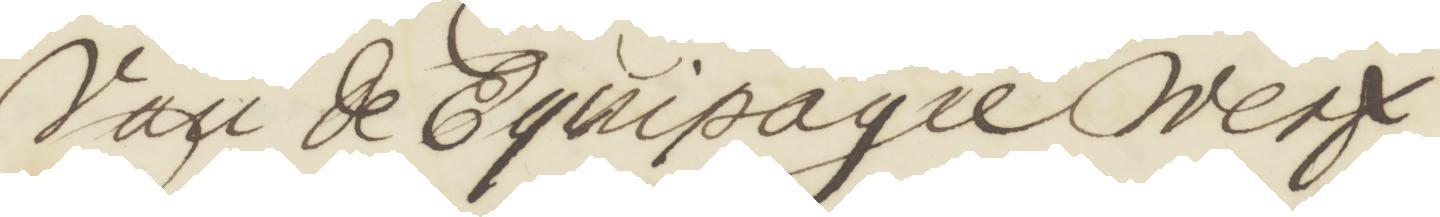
Van de Equipagie werf,
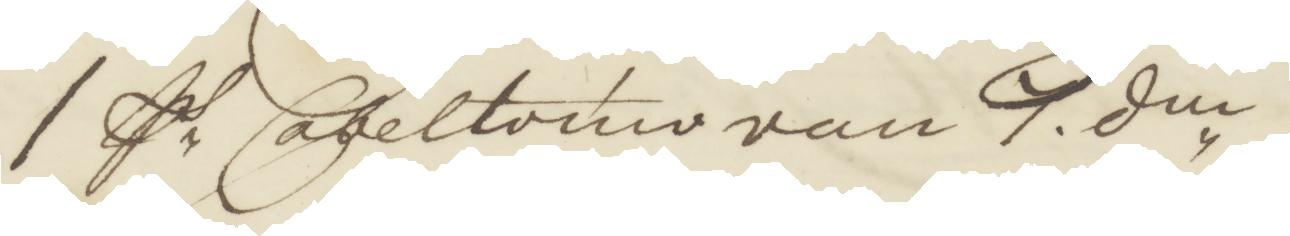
1 p„s Cabeltouw van 7. d„m
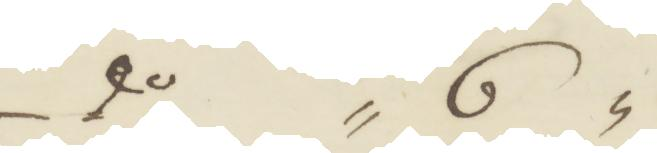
1 „ — — d„o „ 6 „
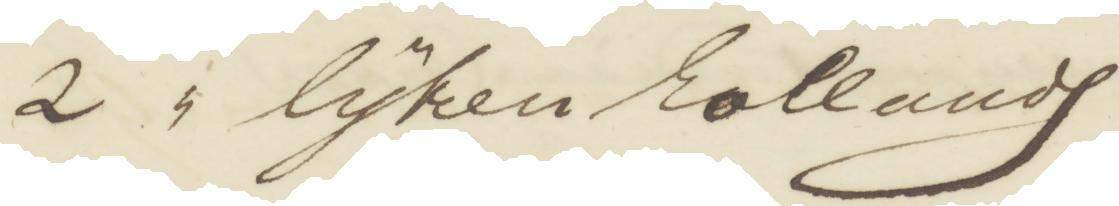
2 „ lijken hollands
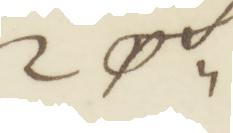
2 p„s
